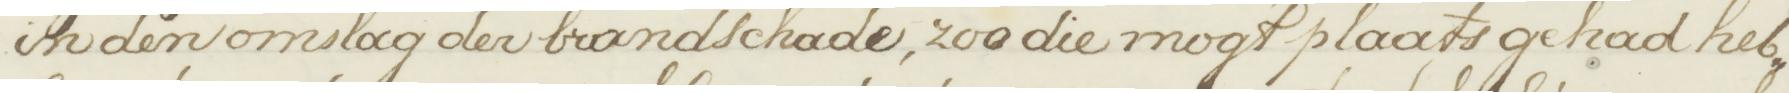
in den omslag der brandschade, zoo die mogt plaats gehad heb„
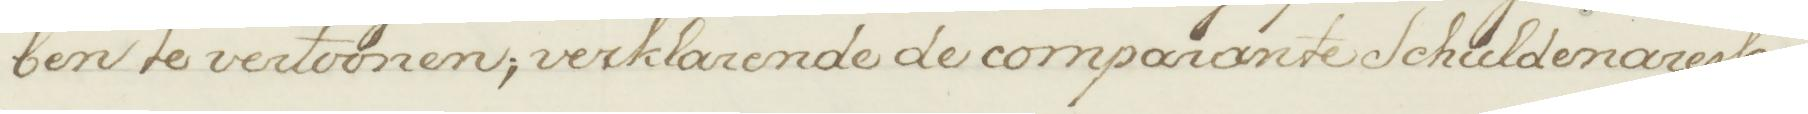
ben te vertoonen; verklarende de comparante Schuldenaresse
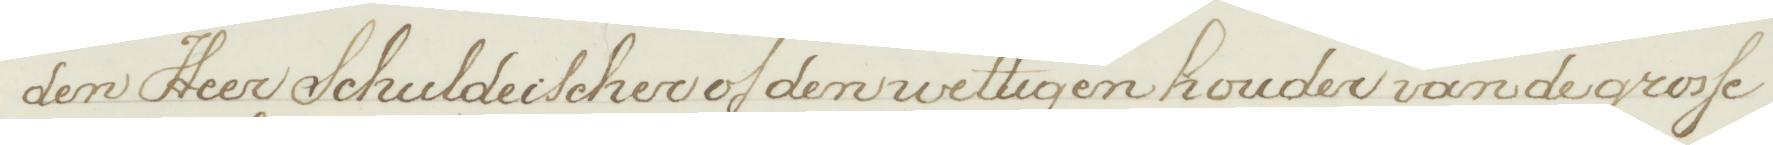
den Heer Schuldeischer of den wettigen houder van de grosse
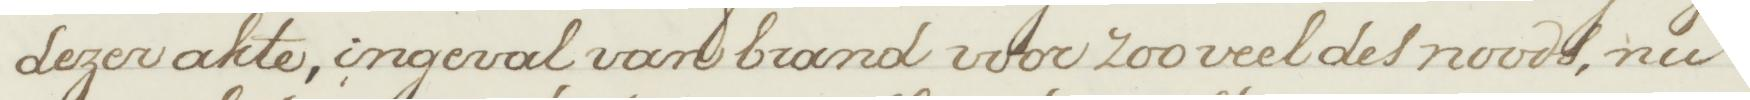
dezer akte, ingeval van brand voor zoo veel des noods, nu
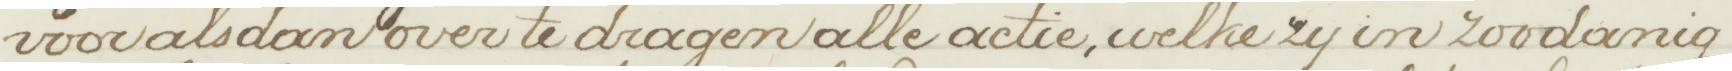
voor als dan over te dragen alle actie, welke zy in zoodanig
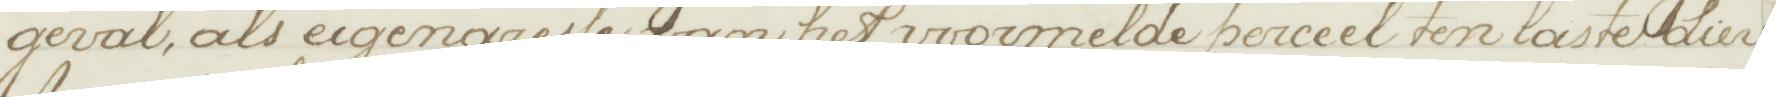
geval, als eigenaresse van het voormelde perceel ten laste dier
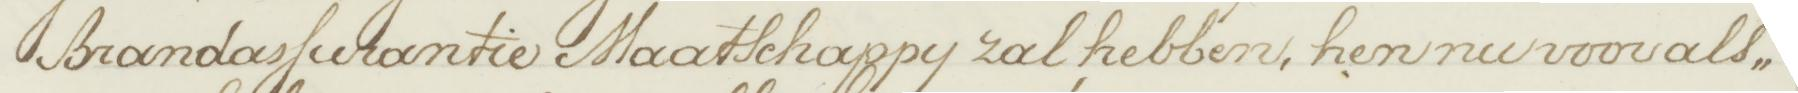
Brandassurantie Maatschappy zal hebben, hen nu voor als„
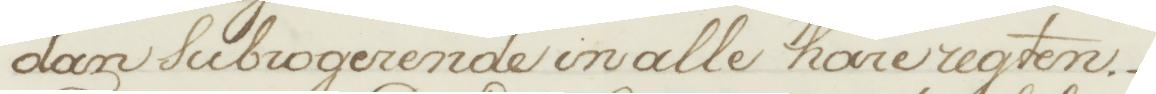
dan subrogerende in alle hare regten.-
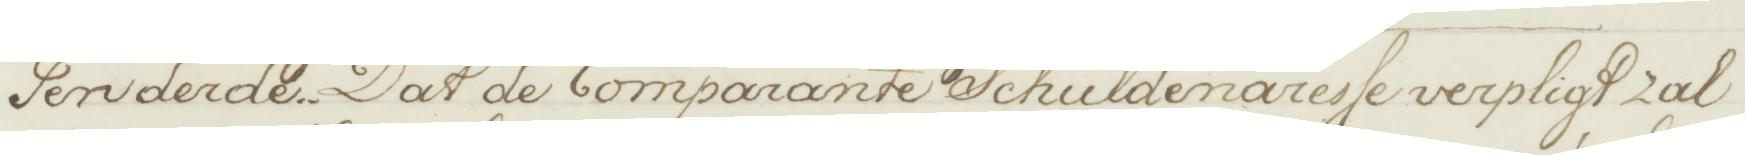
Ten derde.- Dat de Comparante Schuldenaresse verpligt zal
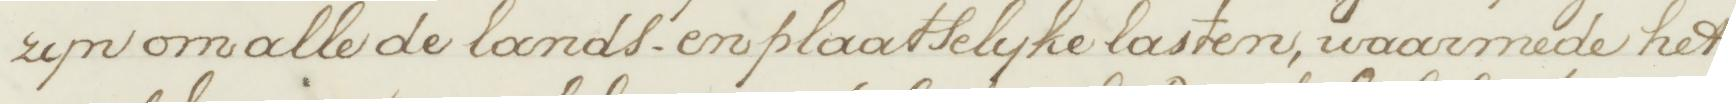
zyn om alle de lands- en plaatselyke lasten, waarmede het
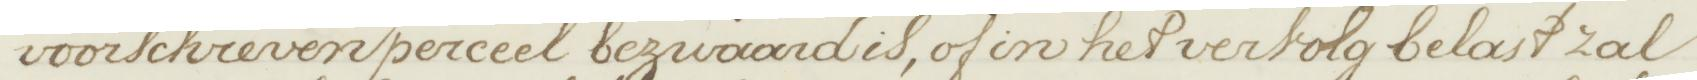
voorschreven perceel bezwaard is, of in het vervolg belast zal
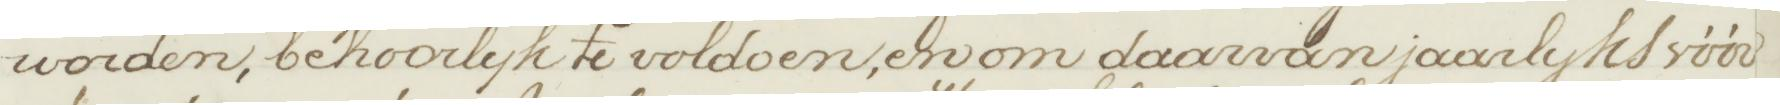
worden, behoorlyk te voldoen, en om daarvan jaarlyks vóór
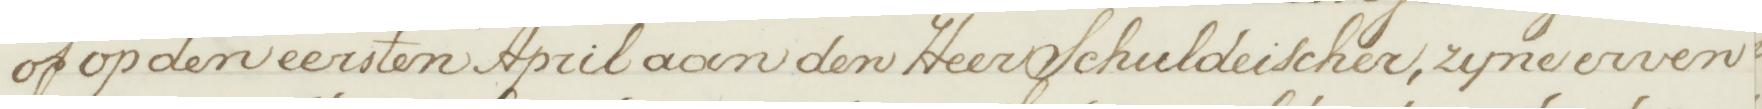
of op den eersten April aan den Heer Schuldeischer, zyne erven:
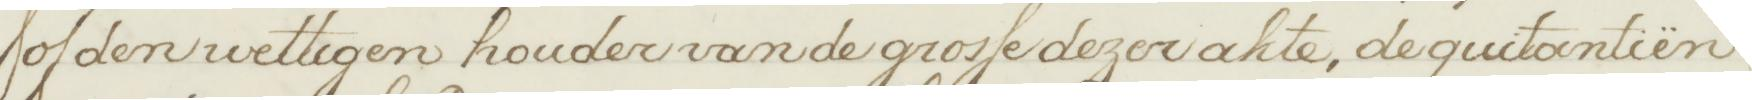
of den wettigen houder van de grosse dezer akte, de quitantiën
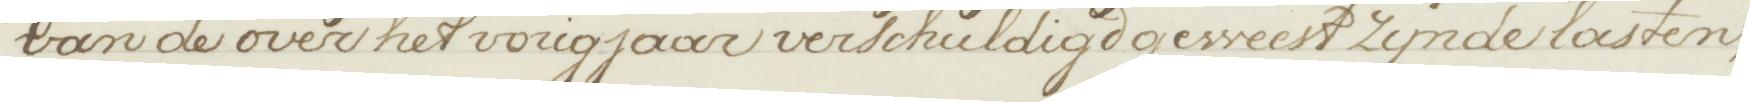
van de over het vorigjaar verschuldigd geweest zynde lasten,
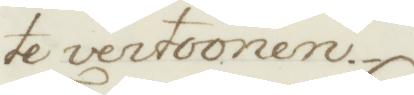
te vertoonen.
